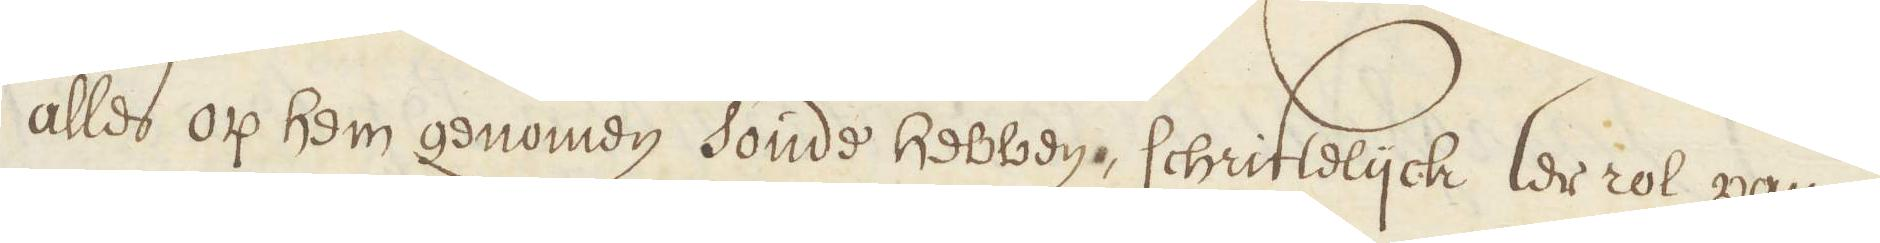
alles op hem genomen soude hebben, schriftelijck ter rol van
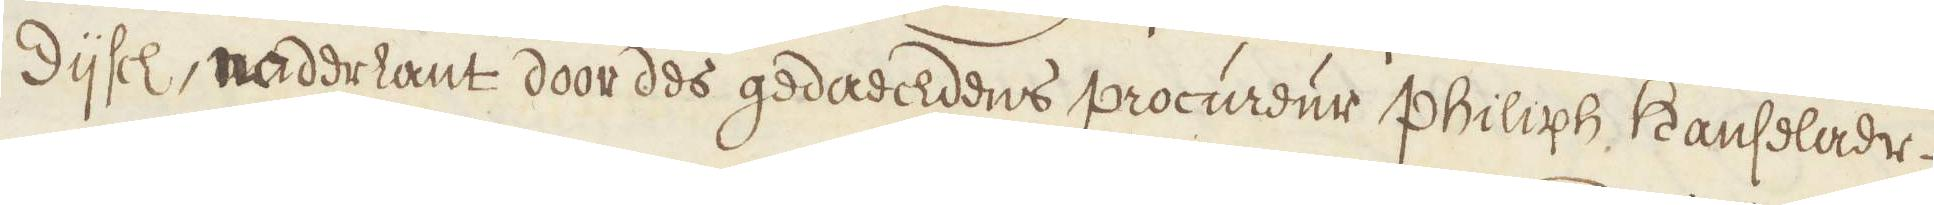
Eijsch, naderhant door des gedaechdens procureur philiph kanselaer
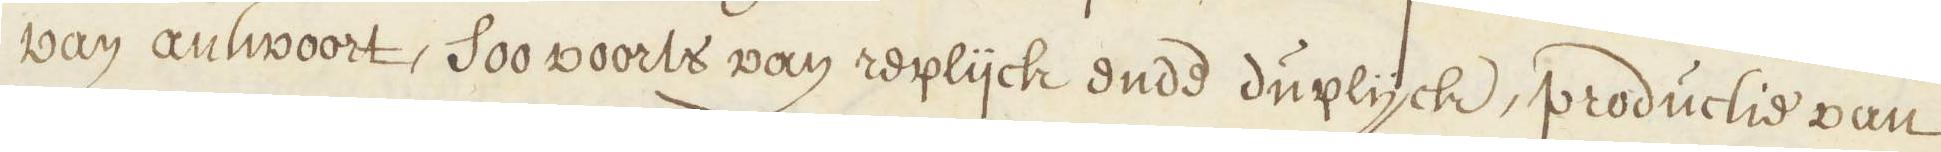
van antwoort, soo voorts van replijck ende duplijck, productie van
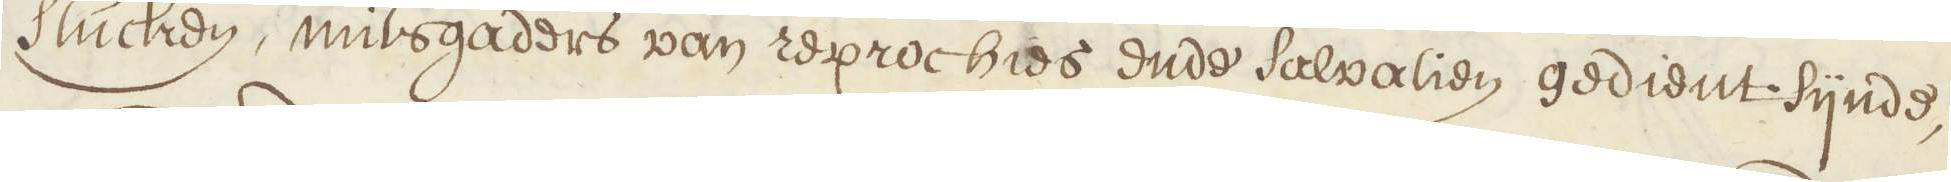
stucken, mitsgaders van reprochies ende salvatien gedient sijnde,
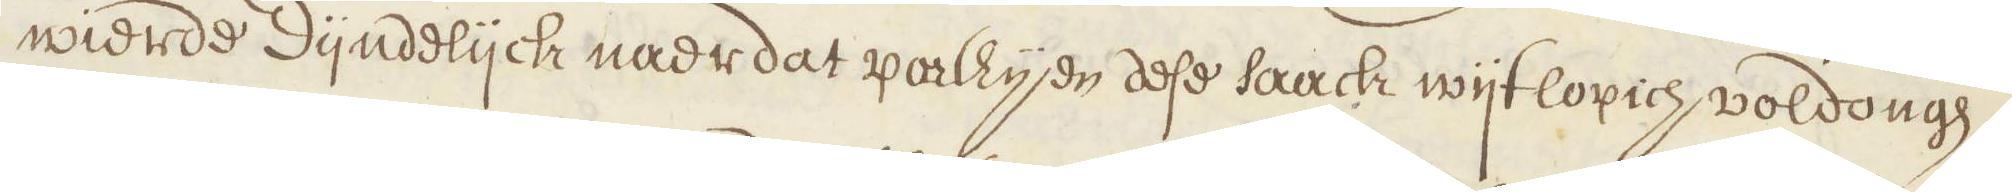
wierde Eijndelijck naer dat parthijen dese saack wijtlopich voldongen
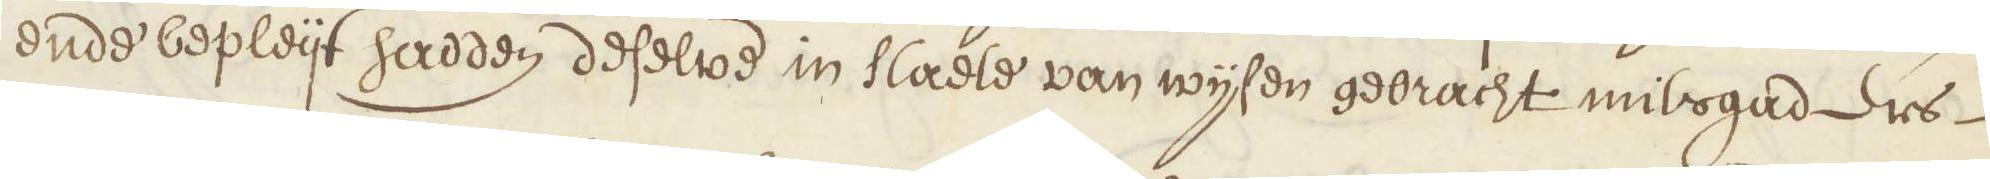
ende bepleijt hadden deselve in staete van wijsen gebracht mitsgaders-
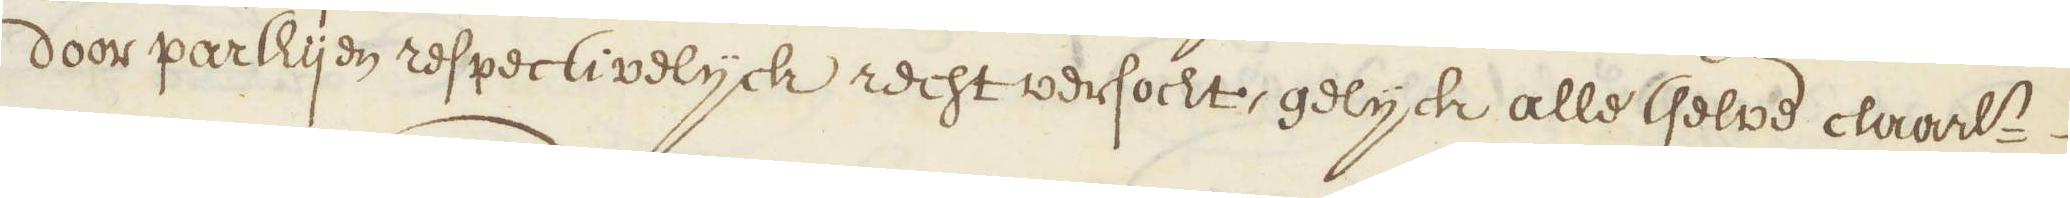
door parthijen respectivelijck recht versocht, gelijck alle tselve claarlijk
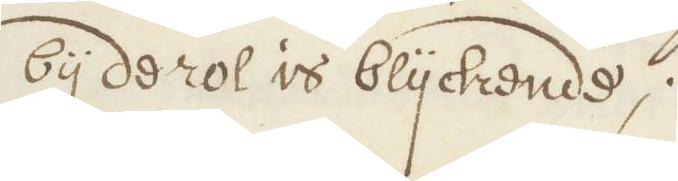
bij de rol is blijkende,
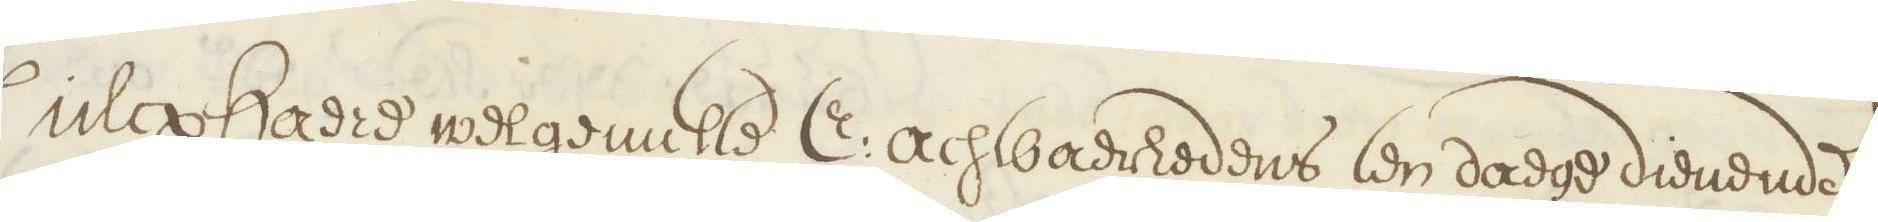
Sulcx haere welgemelte E: achtbaerhedens ten daege dienende
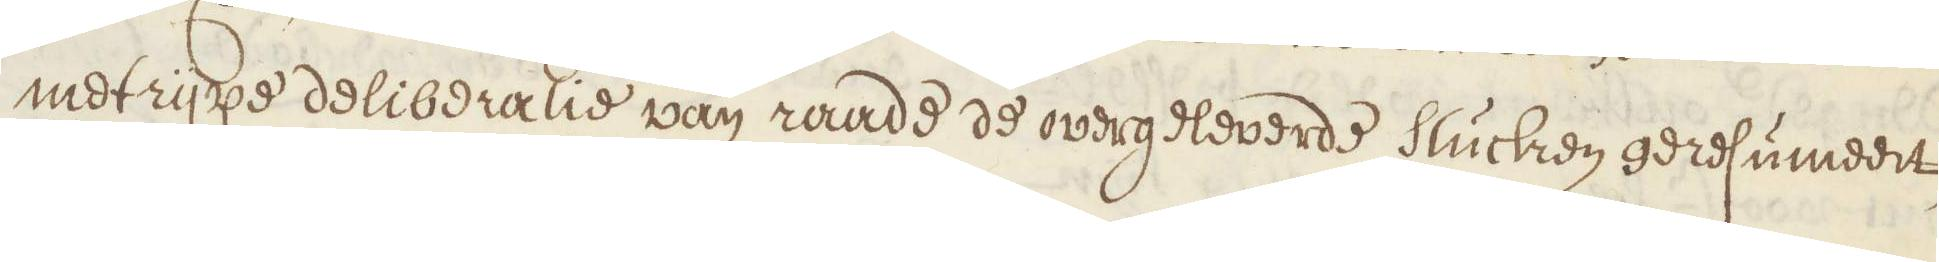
met rijpe deliberatie van raade de overgeleverde stucken geresumeert
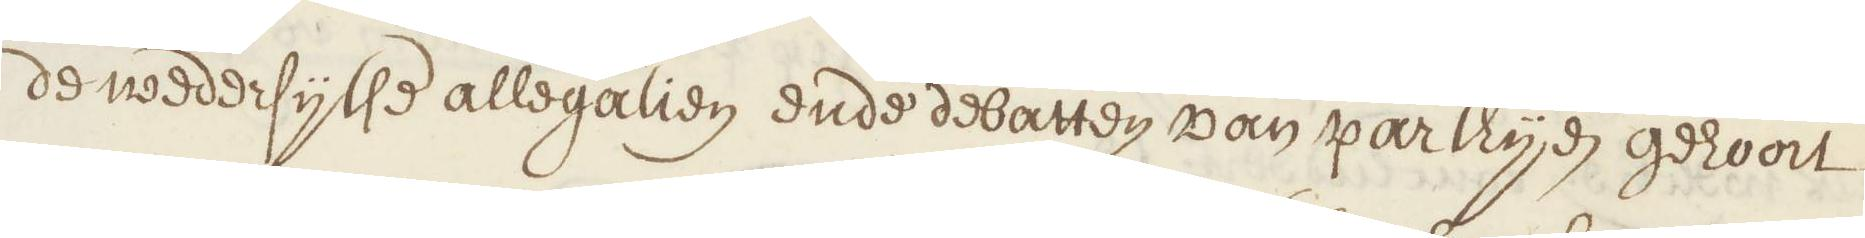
de wedersijtse allegatien ende debatten van parthijen gehoort
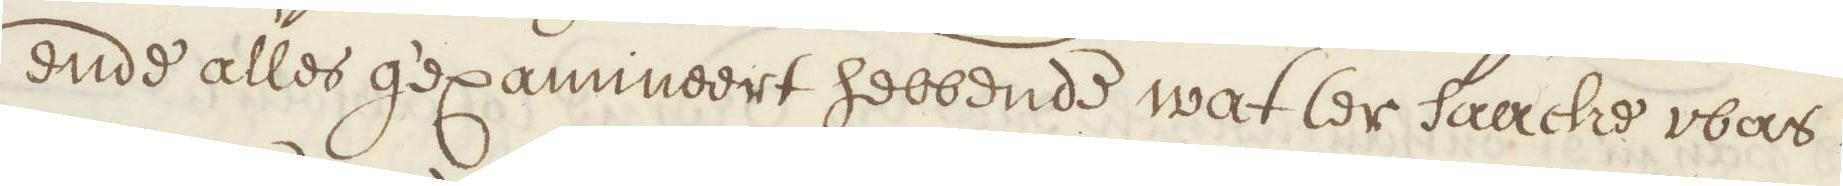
ende alles g'examineert hebbende wat ter saacke was
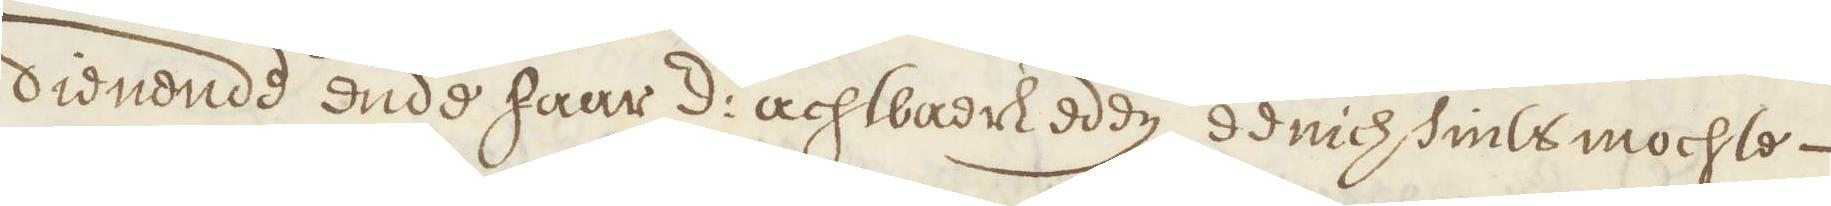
dienende ende haar E: achtbaerheden eenichsints mochte
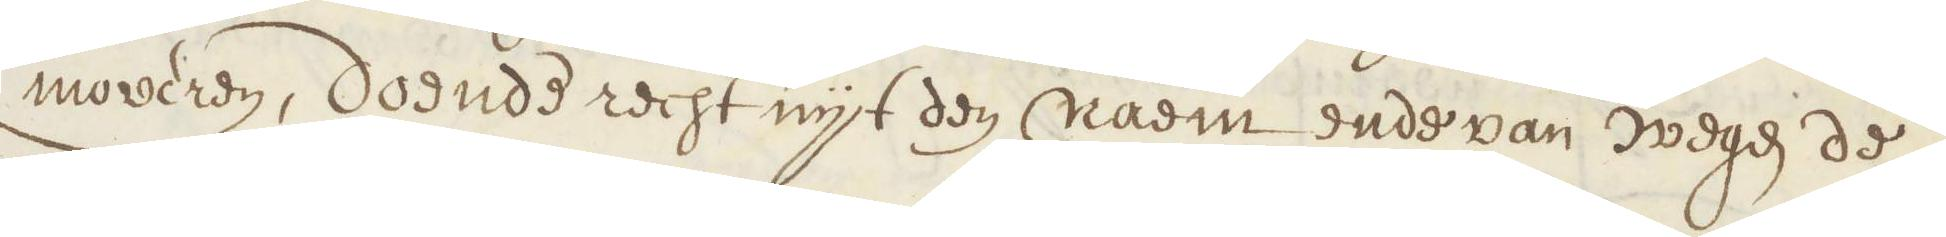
moveren, doende recht uijt den naem ende van wegen de
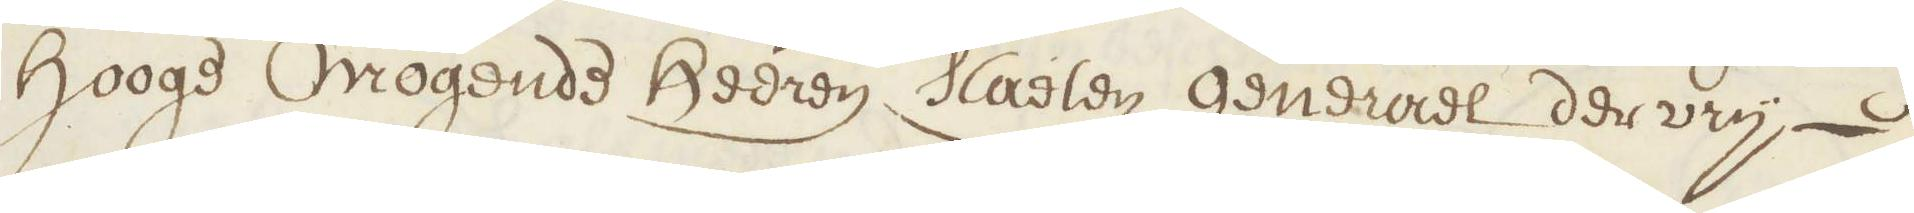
Hooge mogende Heeren staeten generael der vrije
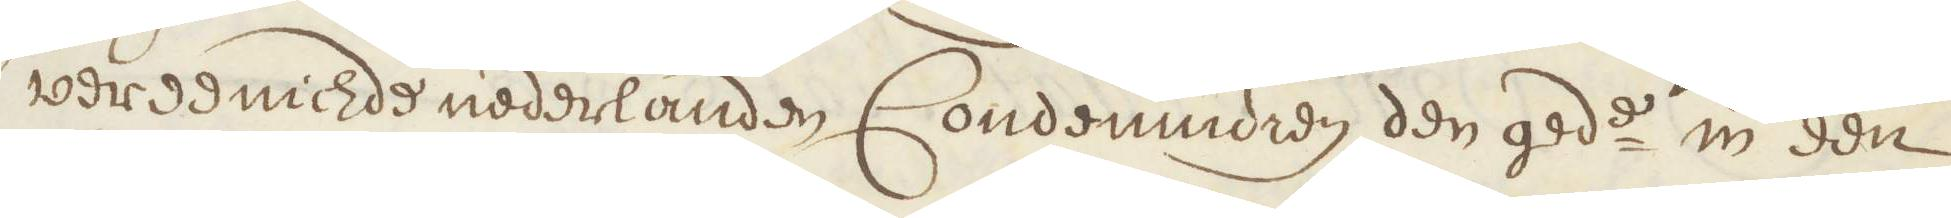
vereenichde nederlanden Condenmeren den ged=e in een
